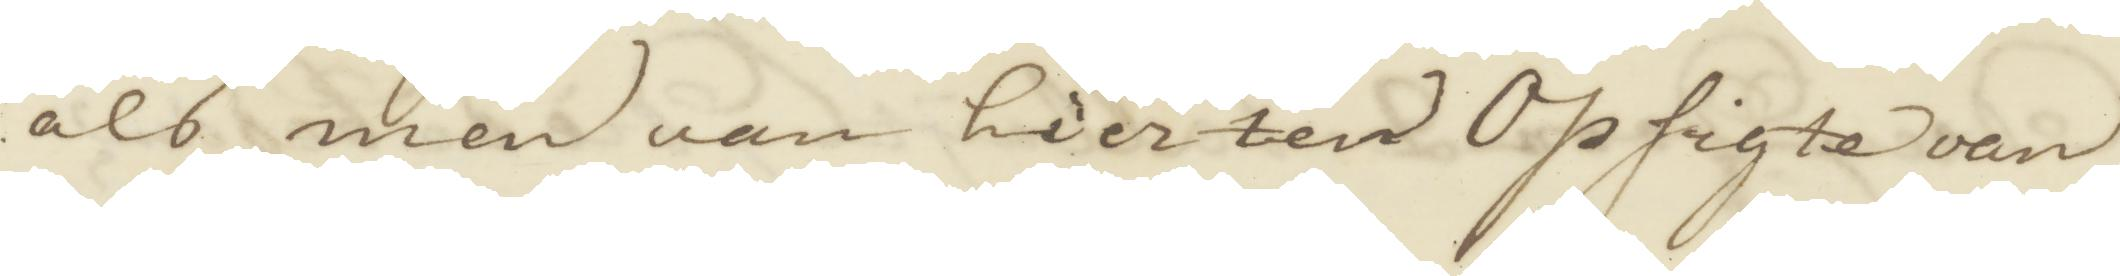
als men aan hier ten opsigte van
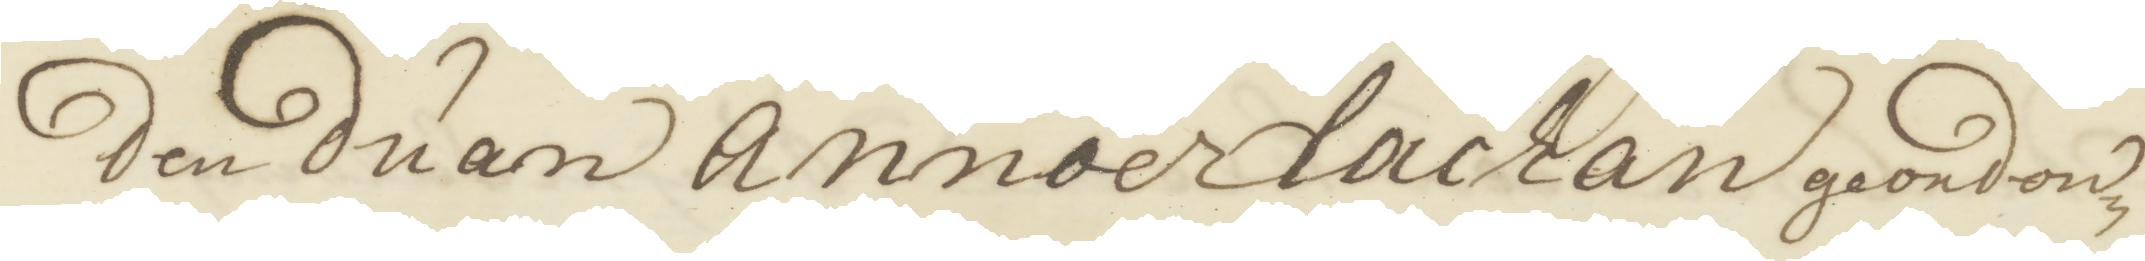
den duan annoerlachan geordon„
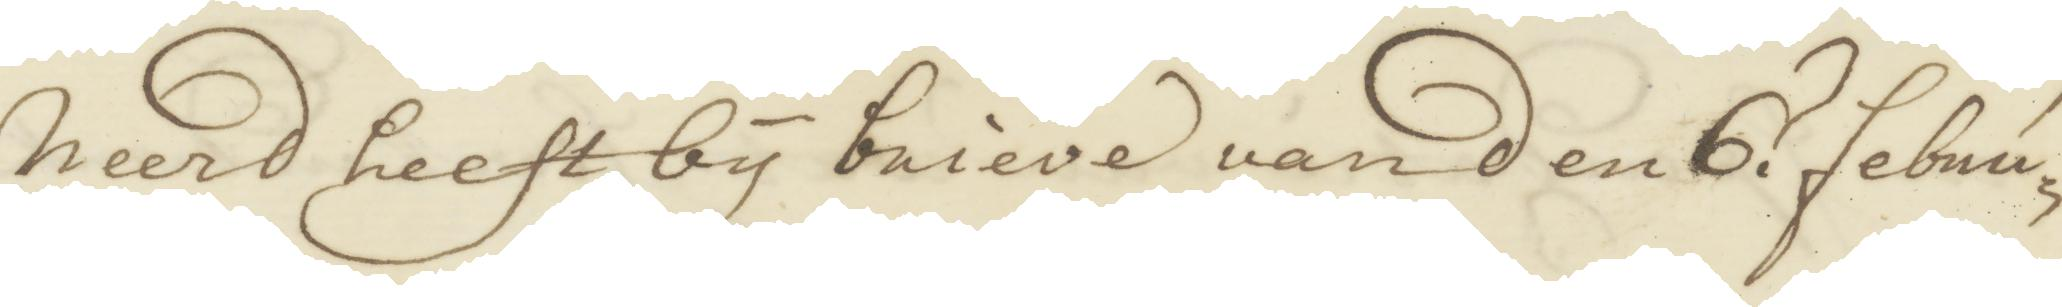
neerd heeft bij brieve van den 6.' febru„
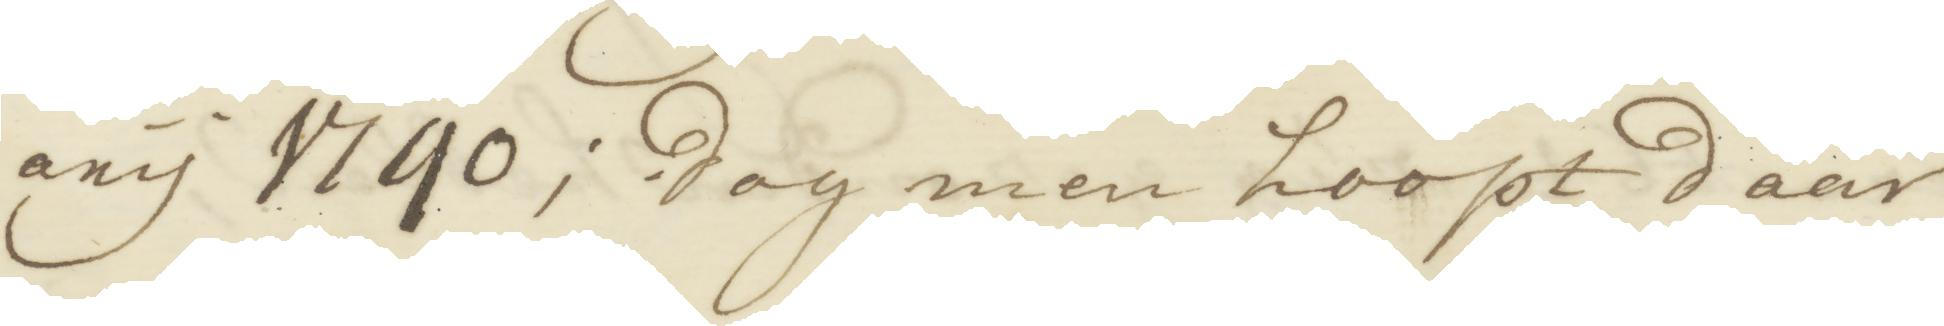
arij 1740; dog men hoopt daar
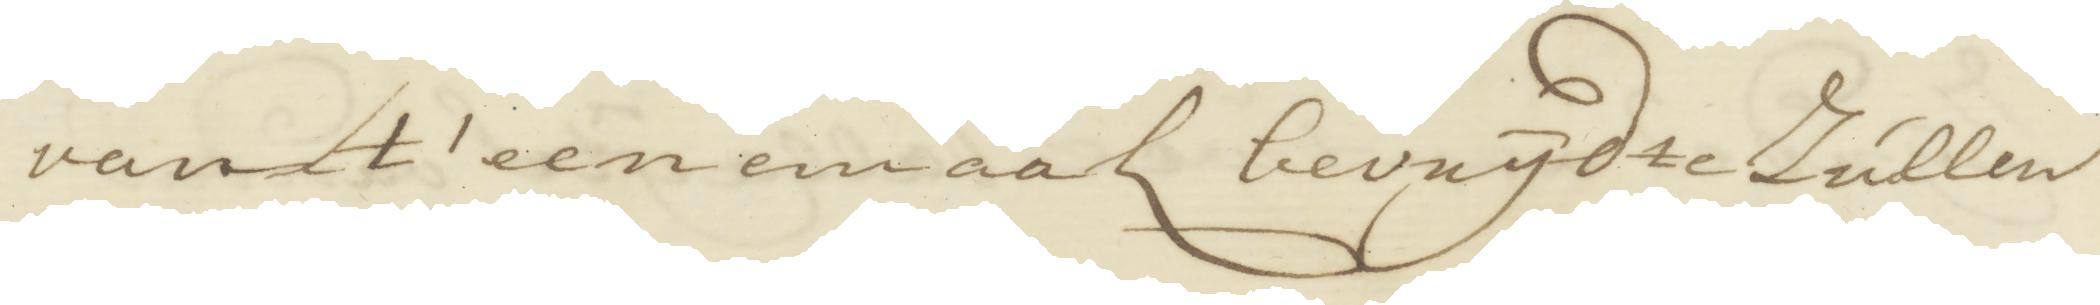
van t' eenemaal bevrijd te zullen
